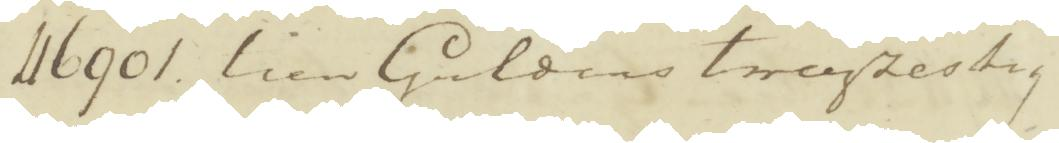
46901 tien Guldens tweeenzestig
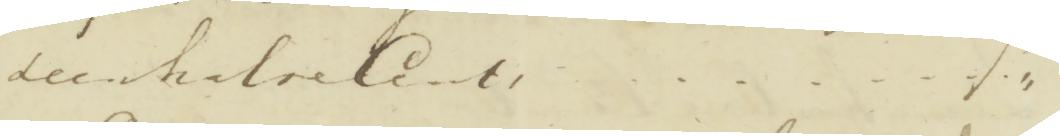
& een halve Cents
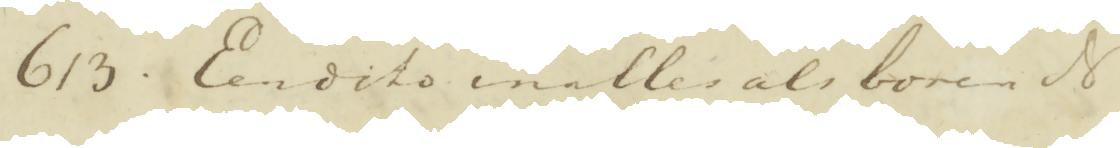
613. Een dito in ales als boven N
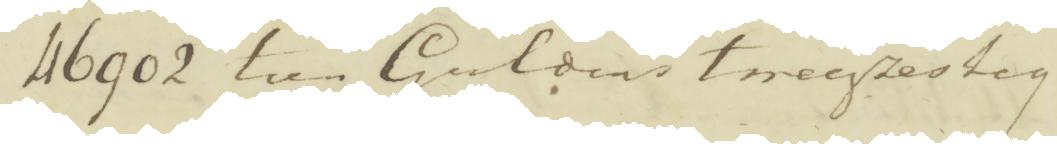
46902 tien Guldens tweeenzestig
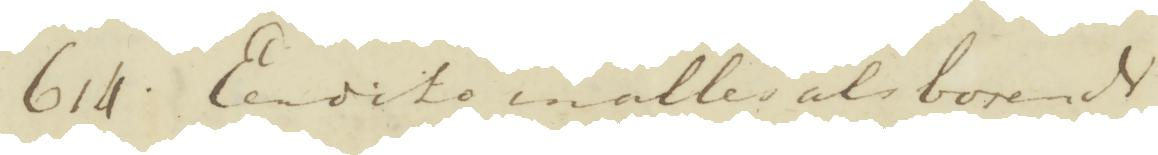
614. Een dito in alles als boven N
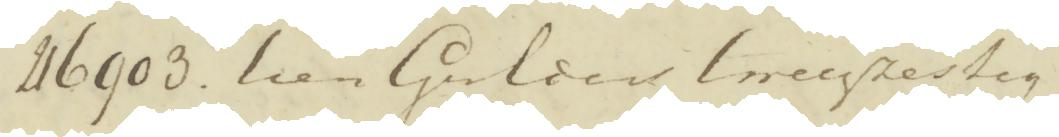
46903. tien Guldens tweeen zestig
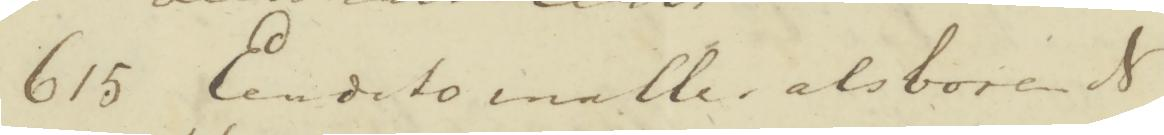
615 Een dito in alles als boven N
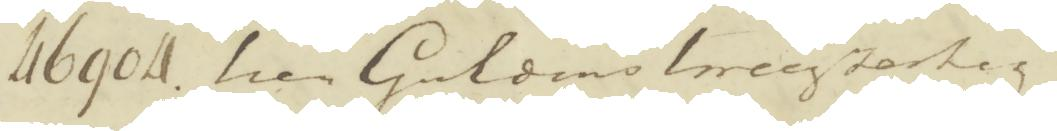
46904. tien Guldens tweeen zestig
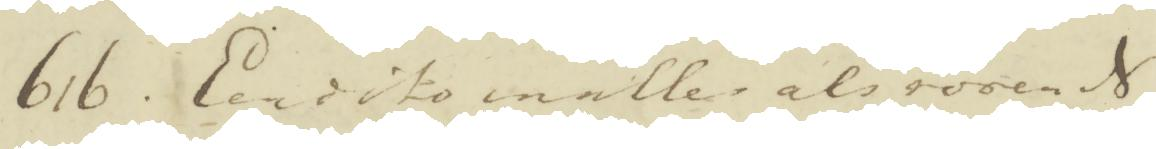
616. Een dito in alles als voren N
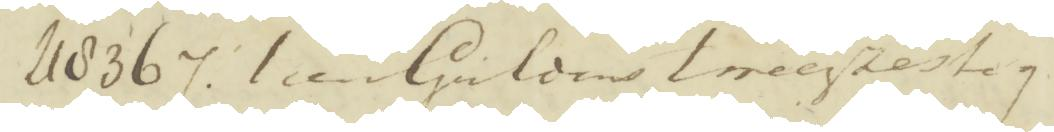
48367. tien Guldens tweeenzestig
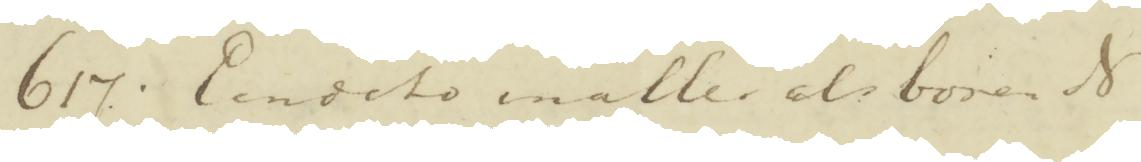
617. Een dito in alles als boven N
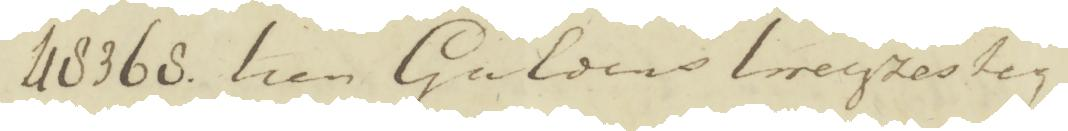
48368. tien Guldens tweeenzestig
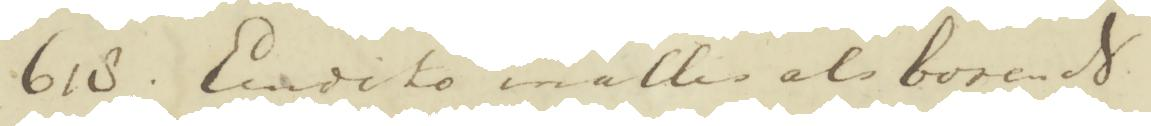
618. Een dito in alles als boven N.
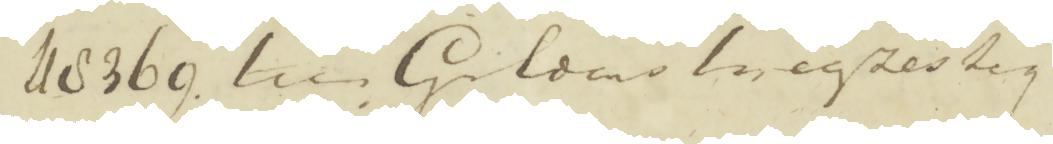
48369 tien Guldens tweeenzestig
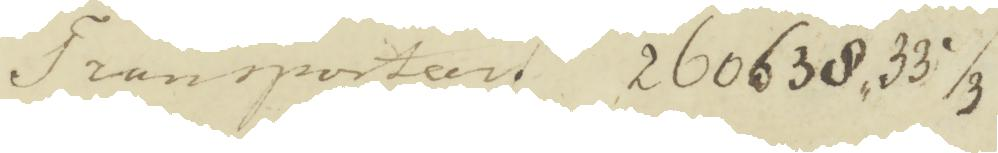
Transporteer ƒ 260638„33 1/3
